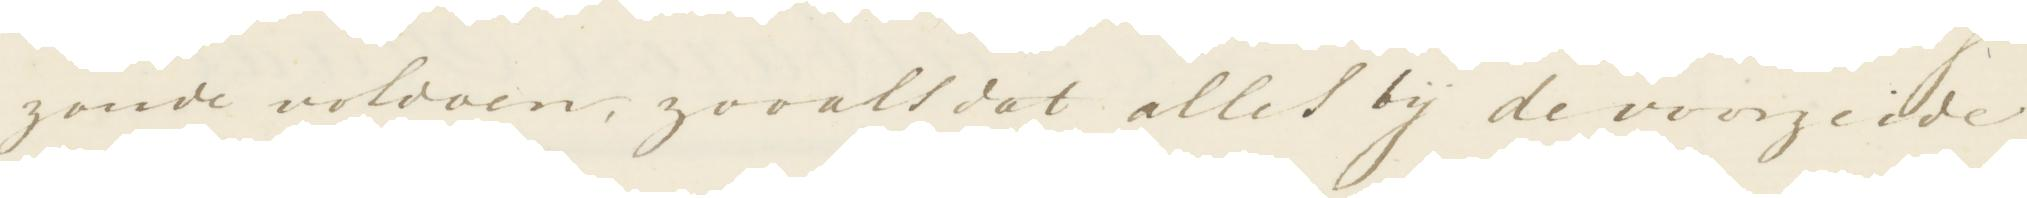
zoude voldoen, zoo als dat alles bij de voorzeide
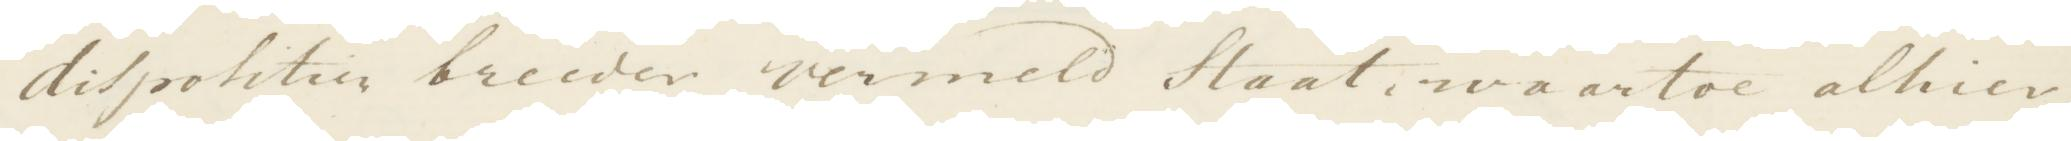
dispositie breeder vermeld Staat, waartoe alhier
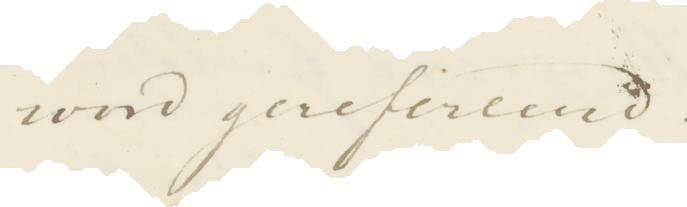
word gerefereerd.
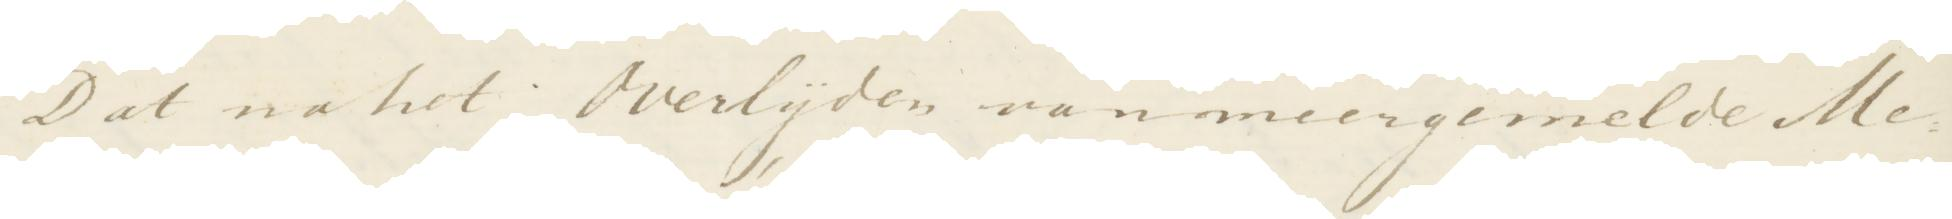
Dat na het overlijden van meergemelde Me=
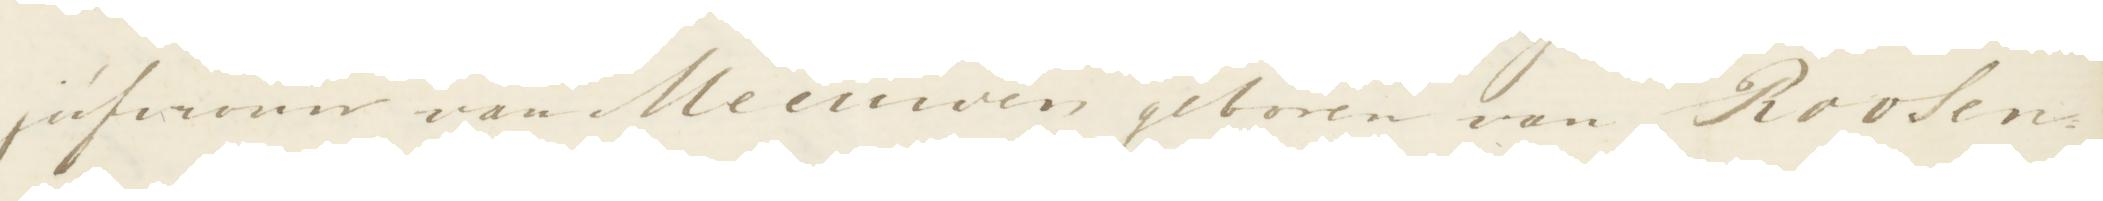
jufvrouw van Meeuwen geboren van Roosen=
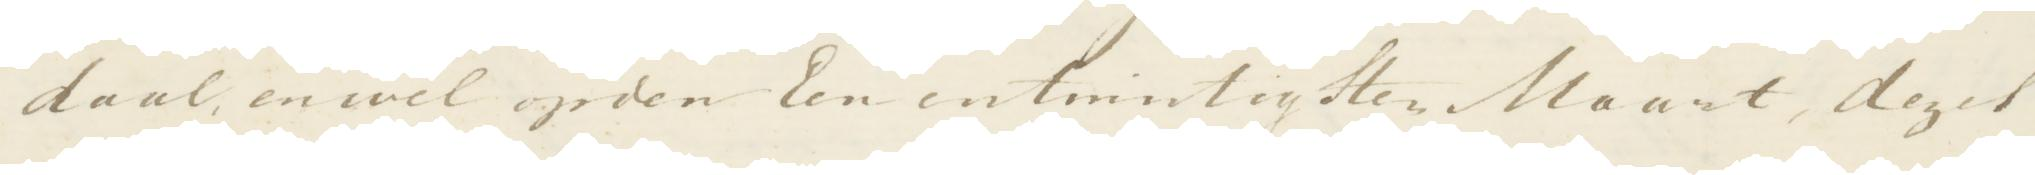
daal en wel op den Een en twintigsten Maart, dezes
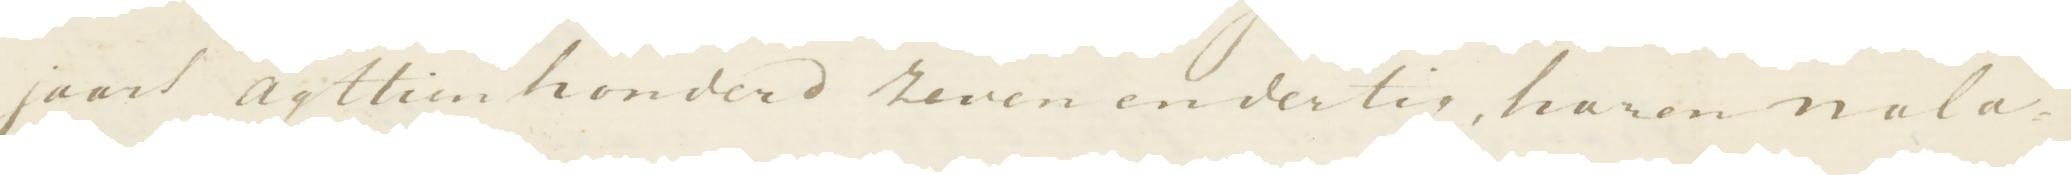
jaars agttien honderd zeven en dertig, haren nala=
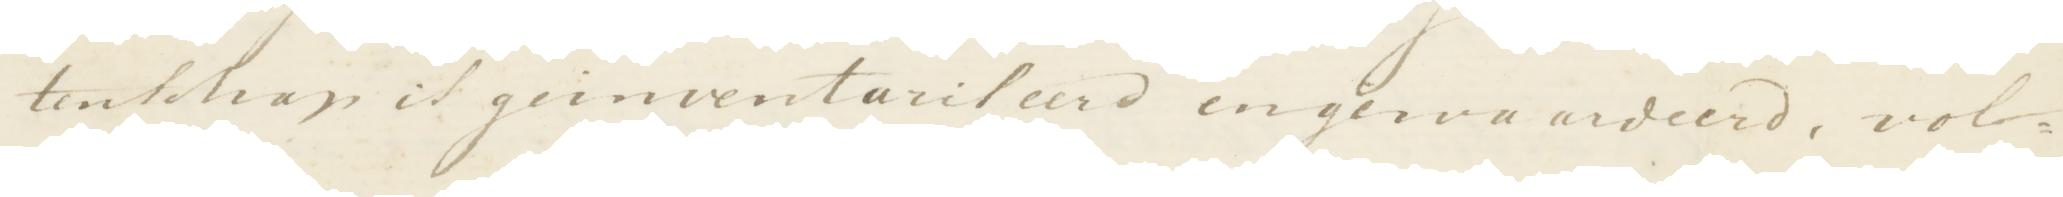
tenschap is geinventariseerd en gewaardeerd, vol=
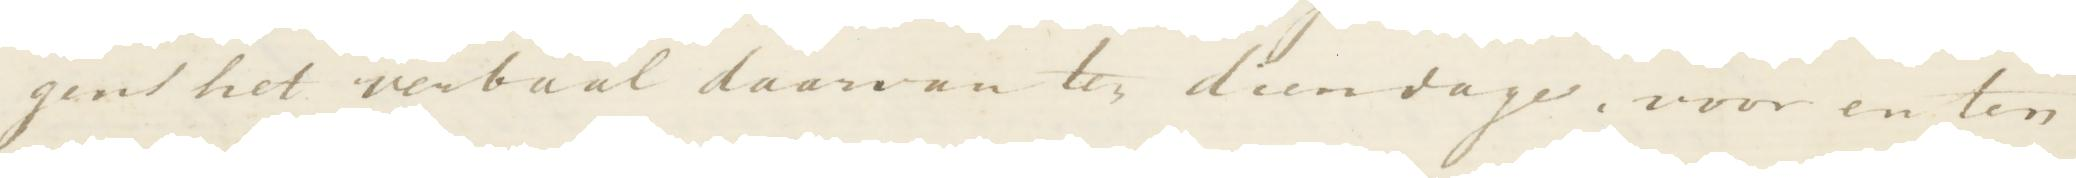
gens het verbaal daarvan ten dien dage, voor en ten
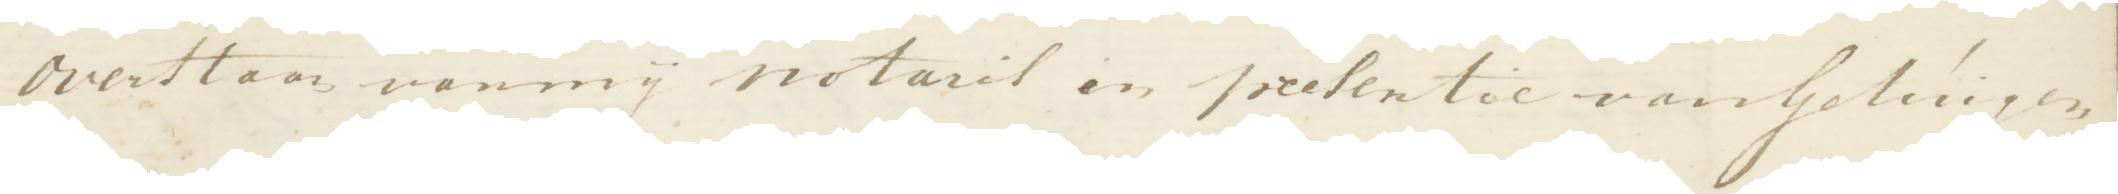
overstaan van mij notaris in presentie van Getuigen
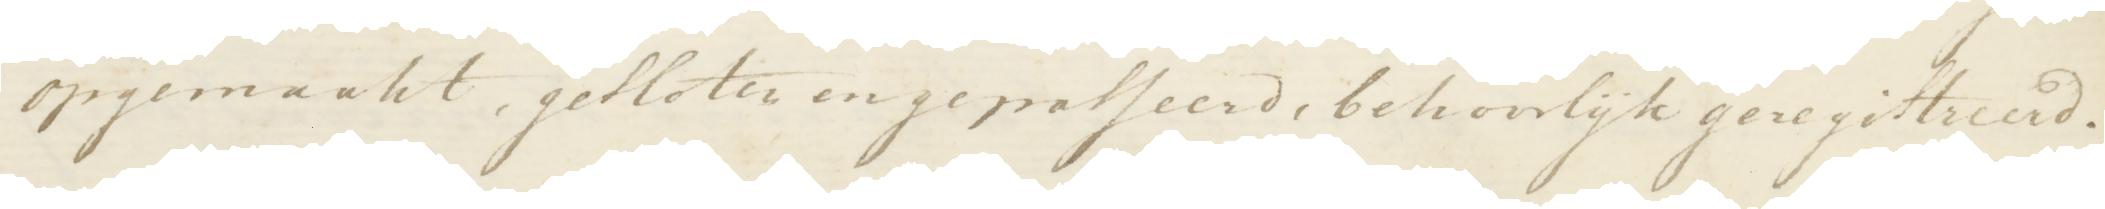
opgemaakt gesloten en gepasseerd, behoorlijk geregistreerd.
